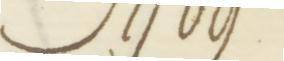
3409
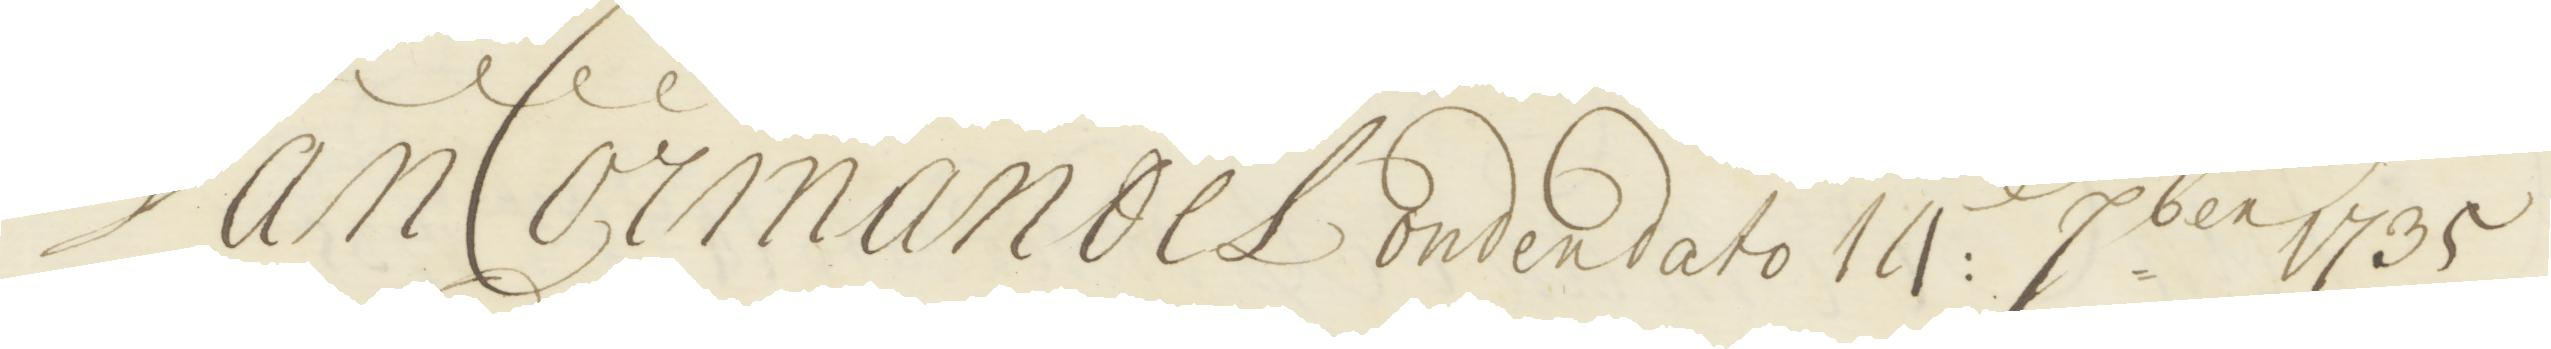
Van Cormandel onder dato 14:e 7=ber 1735
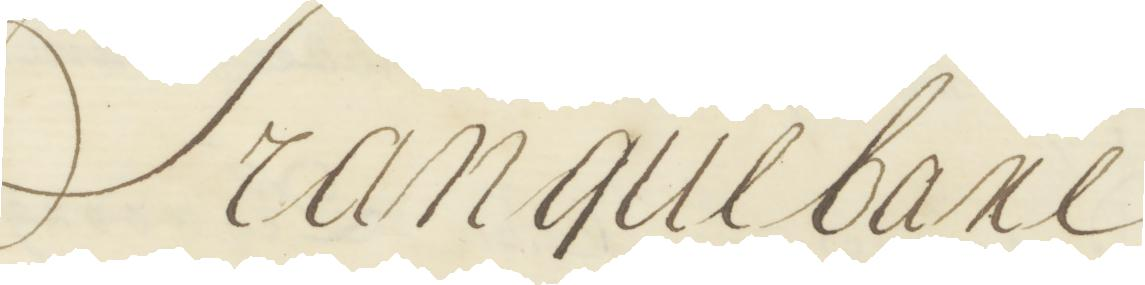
Tranquebare
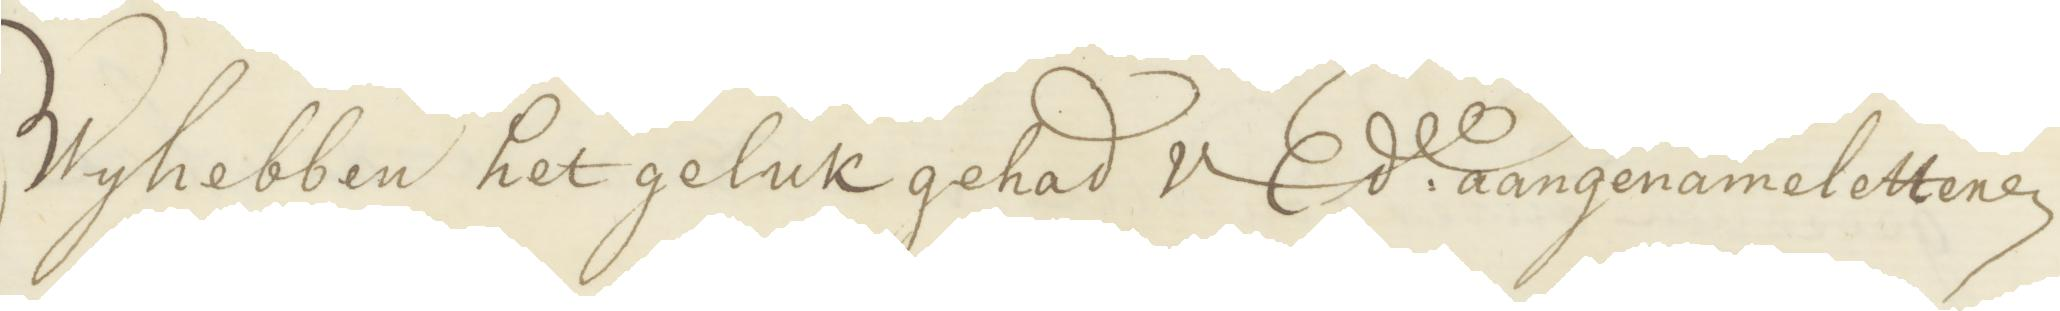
Wy hebben het geluk gehad vEd:e aangename letteren
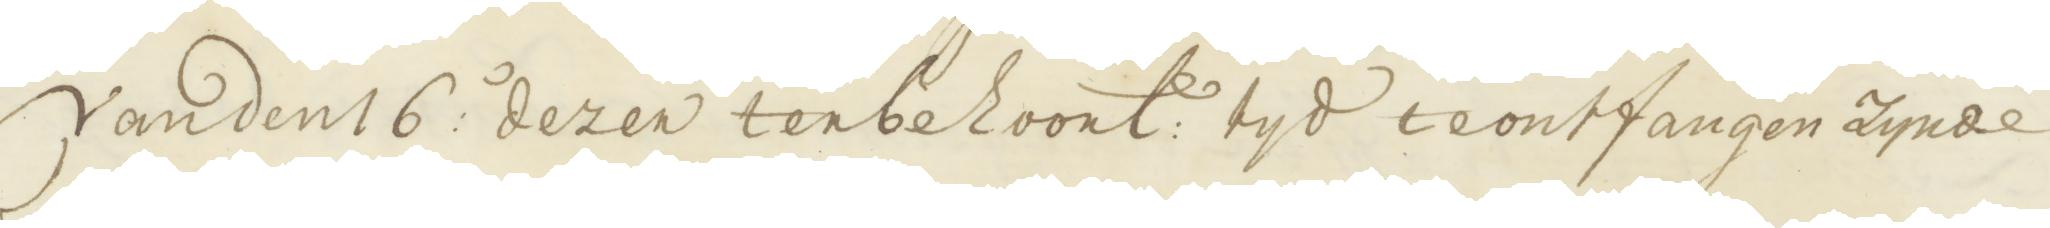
van den 16:e dezer ter behoorl:e tyd te ontfangen zynde
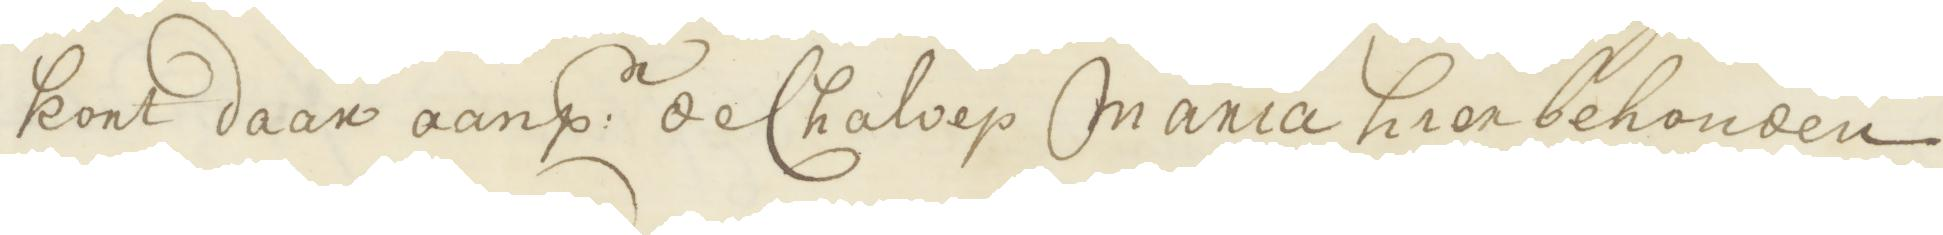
kort daar aan p:r de Chaloep Maria hier behouden
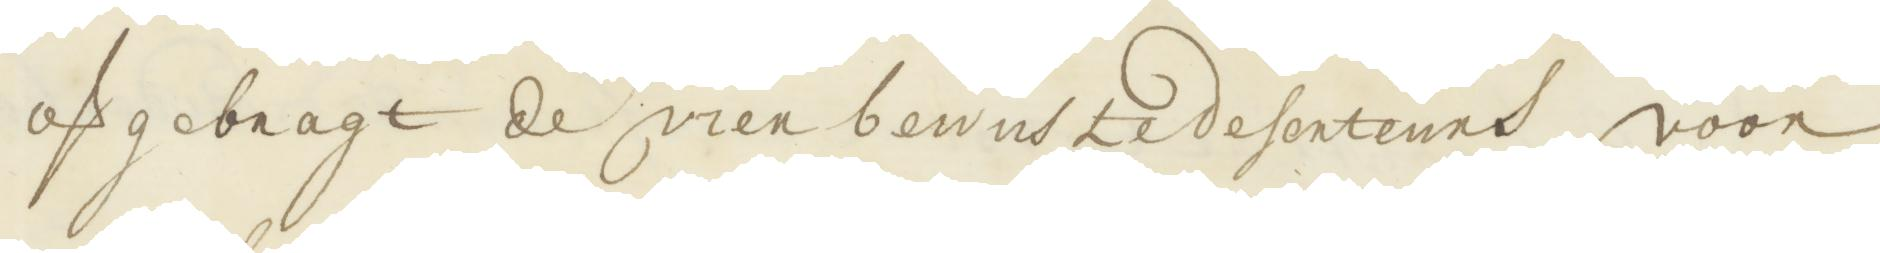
overgebragt de vier bewuste deserteurs voor
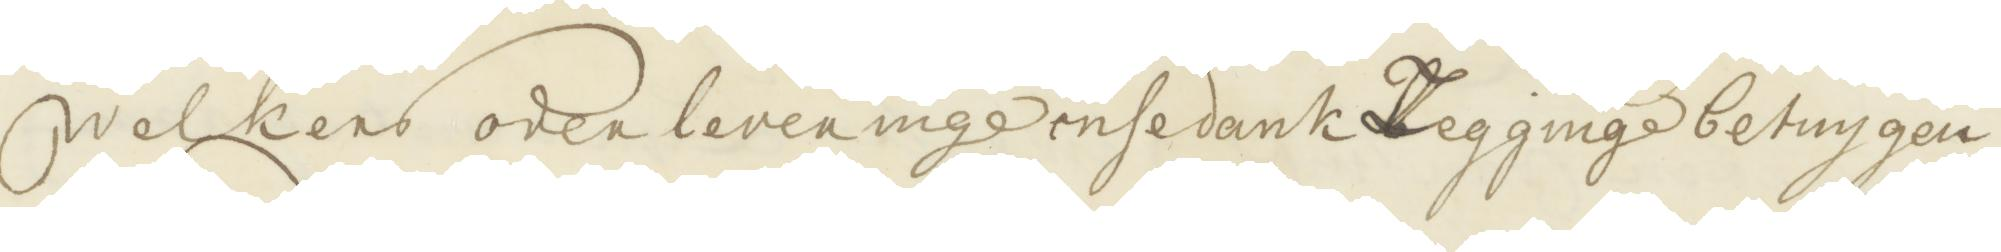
welkers over leveringe onse dank Zegginge betuygen
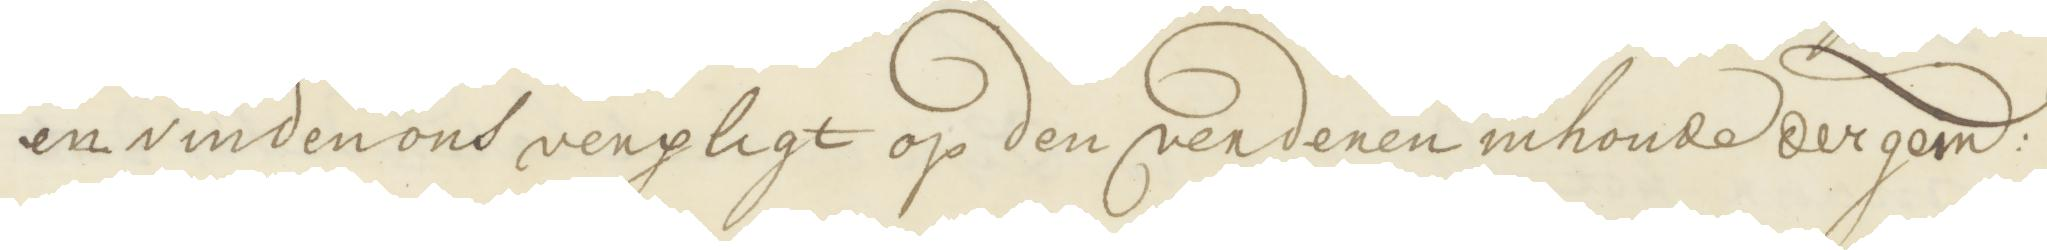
en vinden ons verpligt op den verderen inhoude der gem:
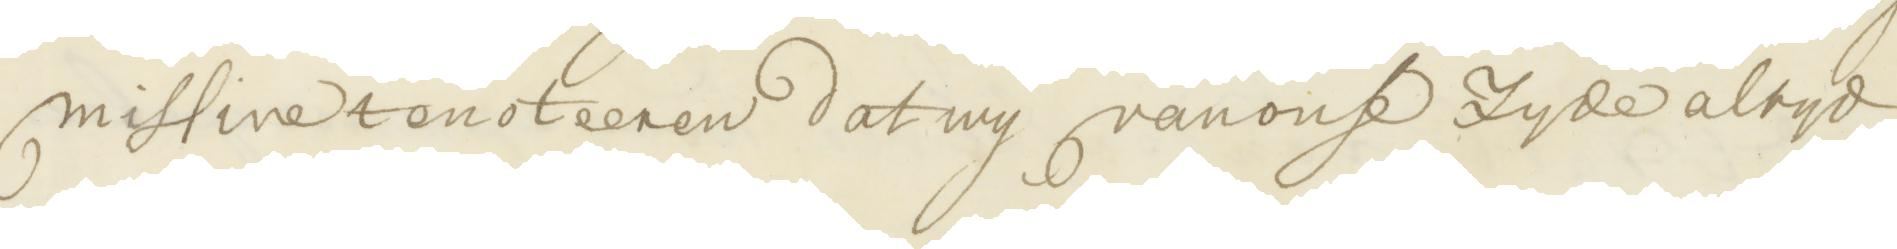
missive te noteeren dat wy van onse Zyde altyd
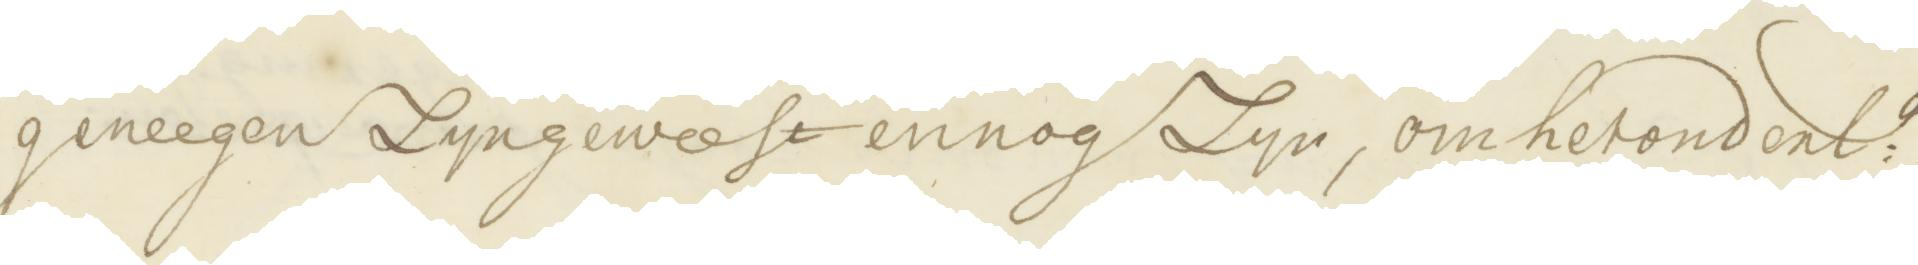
geneegen Zyn geweest en nog Zyn, om het onderl:g
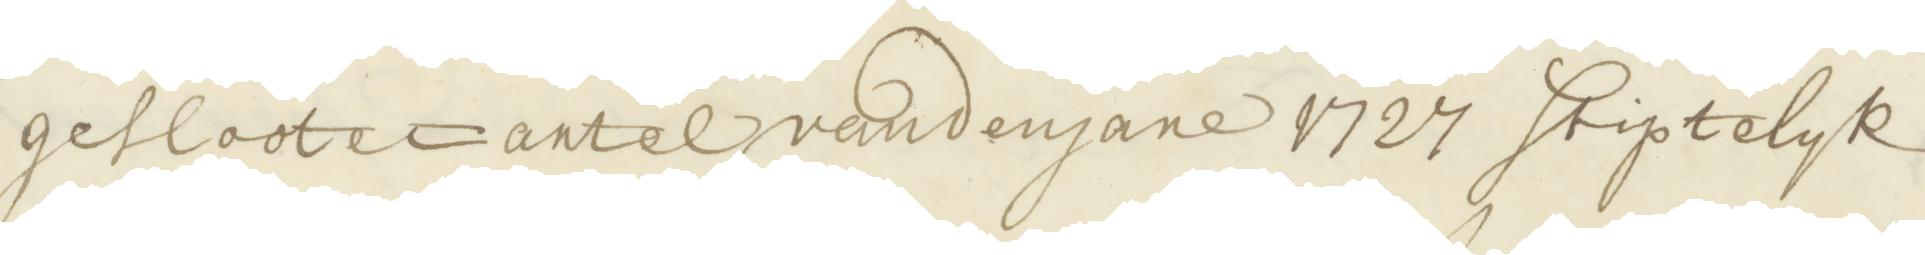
gesloote cartel van den jare 1727 Stiptelyk
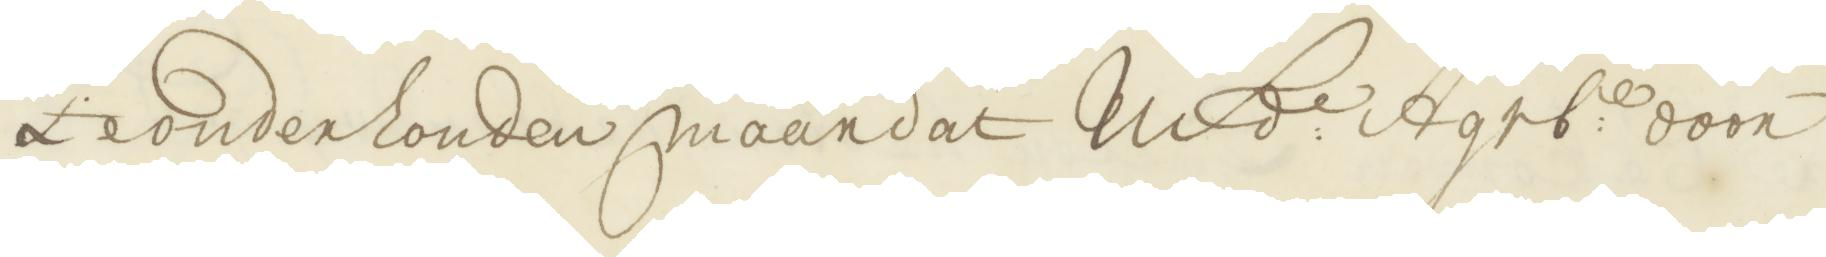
te onderhouden maar dat UEd:e Agtb:e door
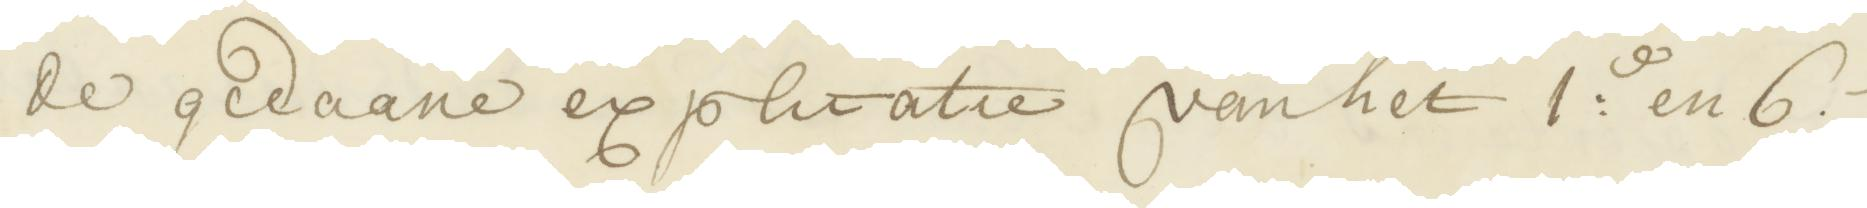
de gedaane explicatie van het 1:e en 6:'
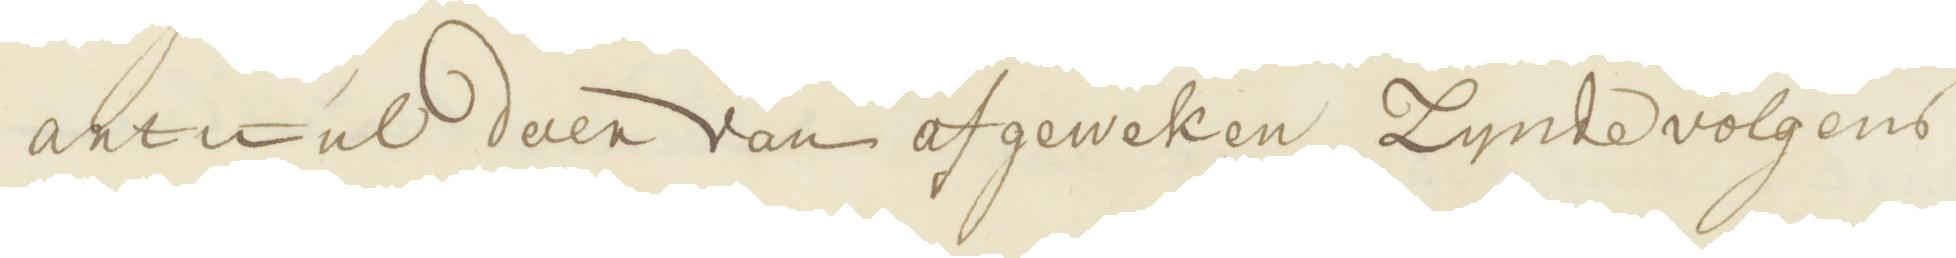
articul daer van afgeweken Zynde volgens
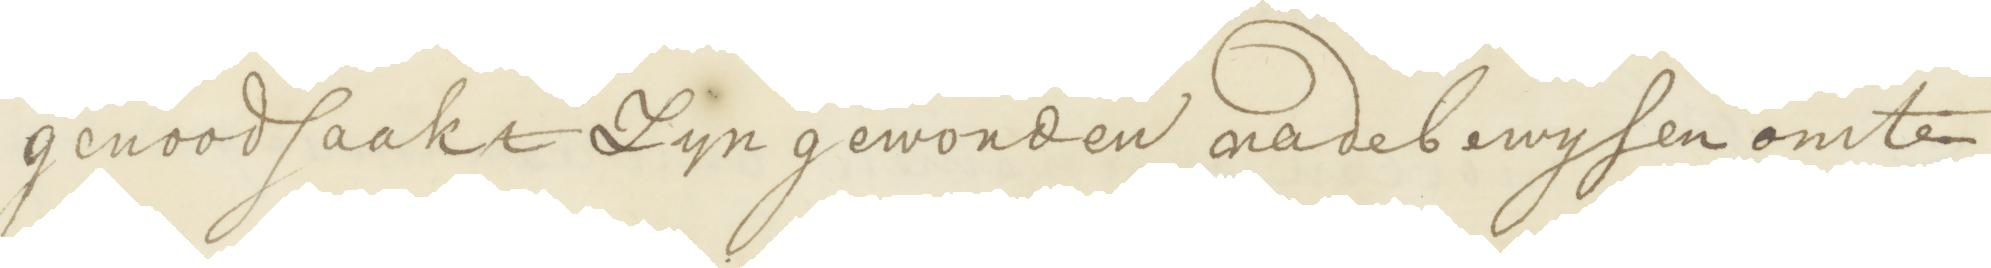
genoodsaakt Zyn geworden na de bewysen om te
